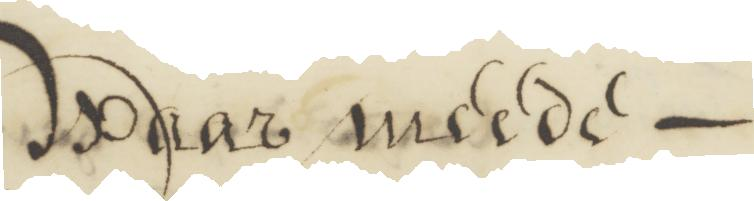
waar meede
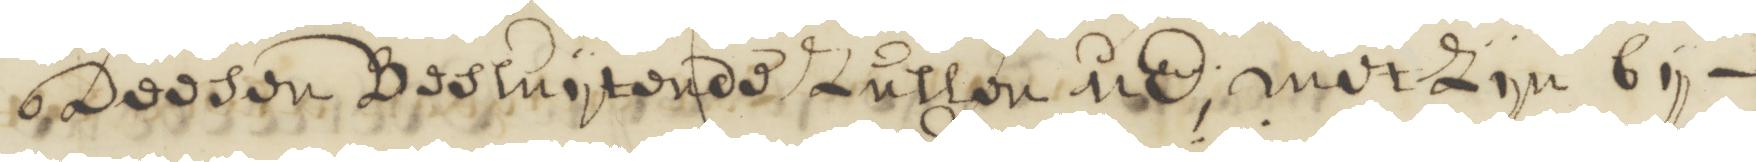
Deesen Besluijtende Zullen uE; met Zijn bij
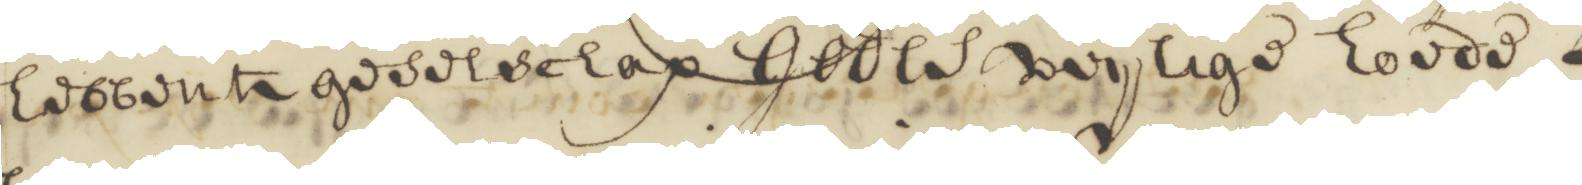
hebbente geselschap Godes veijlige hoede
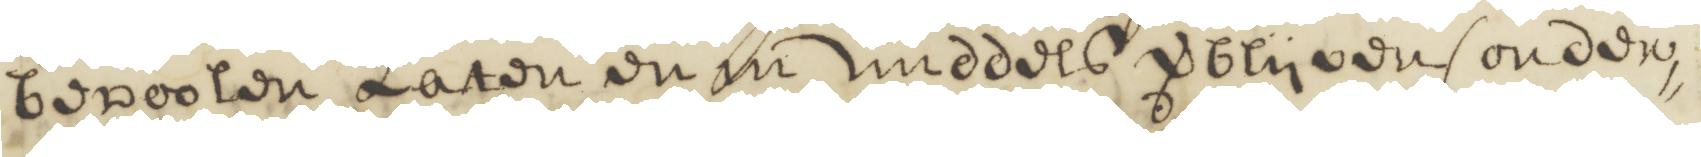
bevoolen Laten en in middels verblijven (onder„
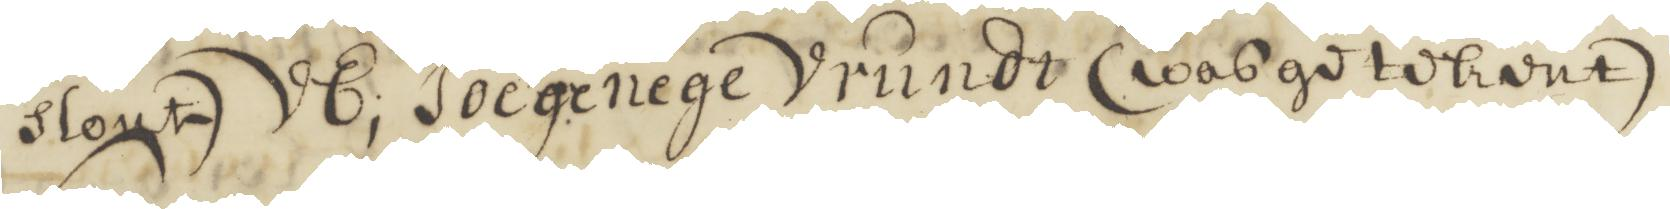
stont) VE; Toegenege Vrundt ( was getekent)
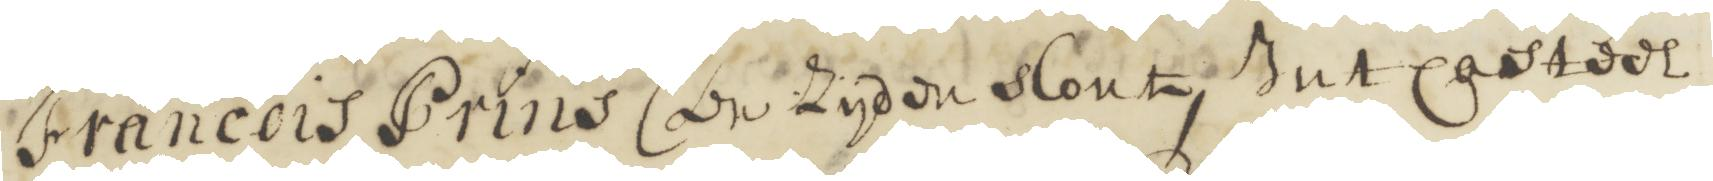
Francois Prins (ter Zijden stont, Int Casteel
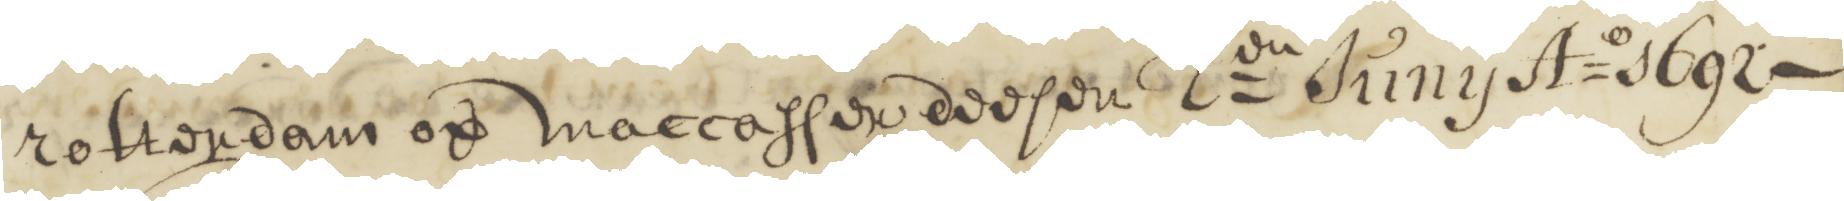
rotterdam op maccasser deesen 2=en Iunij A=o 1692.—
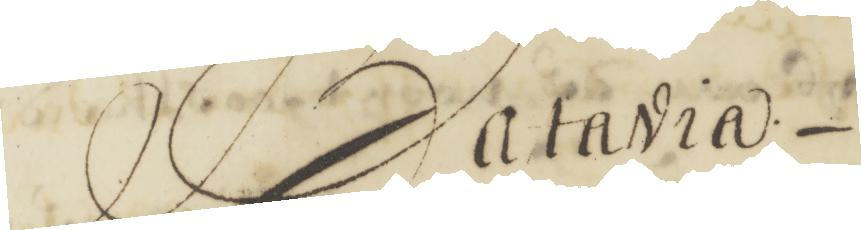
Batavia,-
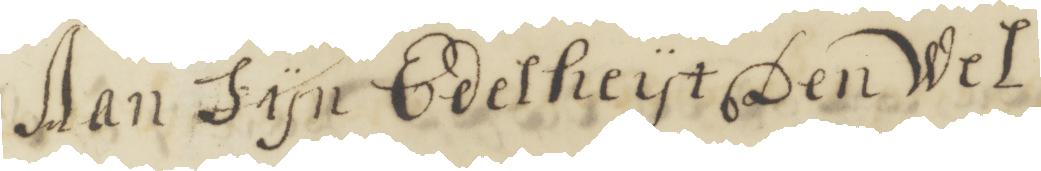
Aan Sijn Edelheijt Den Wel
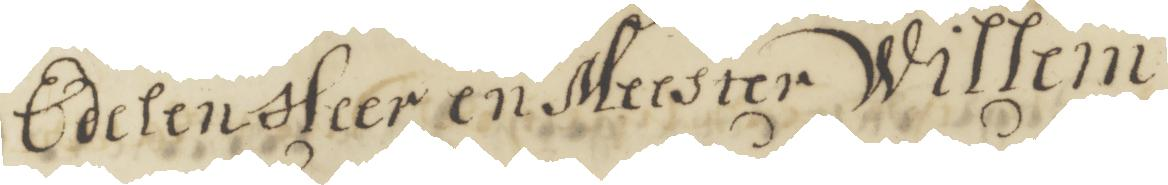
Edelen Heer en Meester Willem
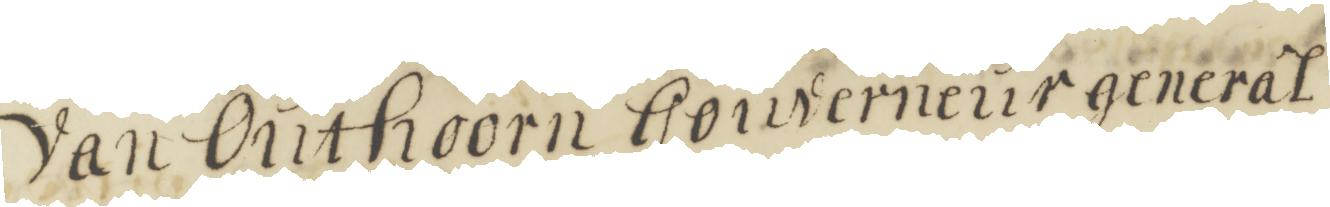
Van Outhoorn Gouverneur general
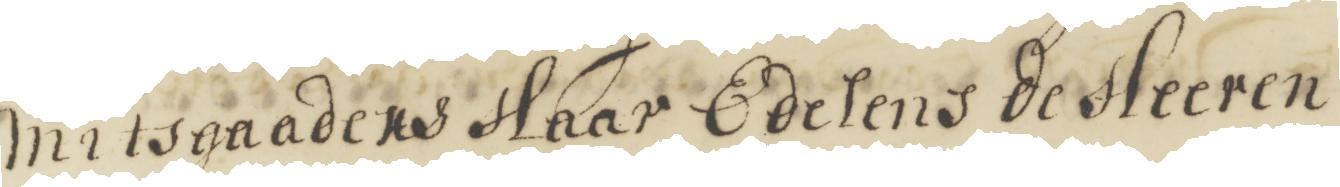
mitsgaaders Haar Edelens de Heeren
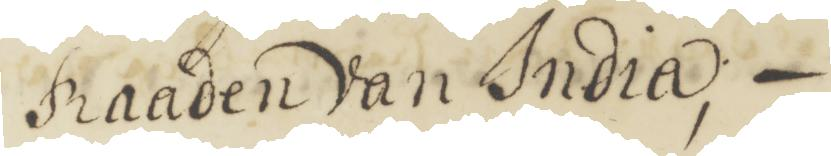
Raaden Van India; —
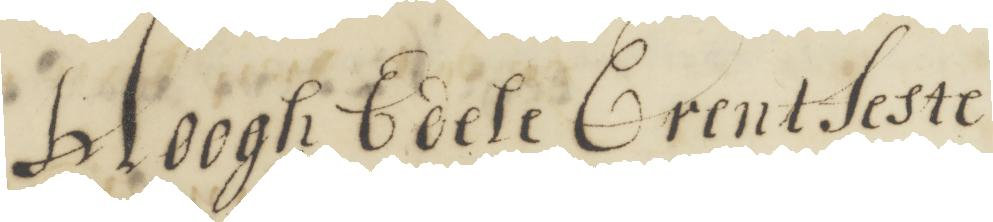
Hoogh Edele Erentfeste
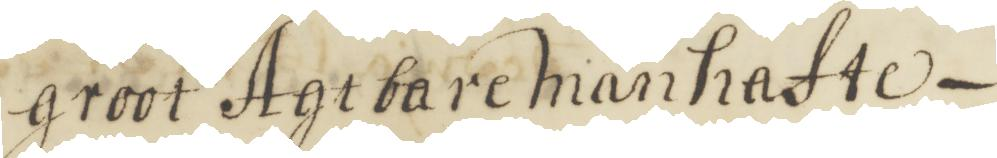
groot Agtbare manhafte —
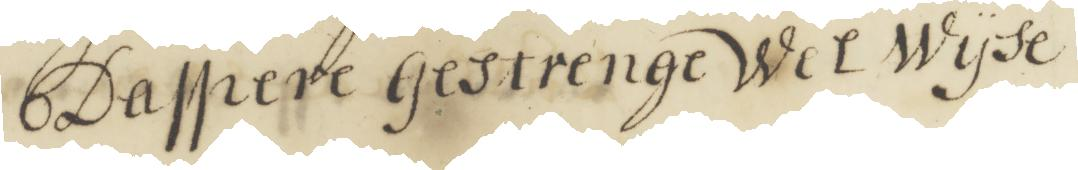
Dappere gestrenge Wel Wijse
